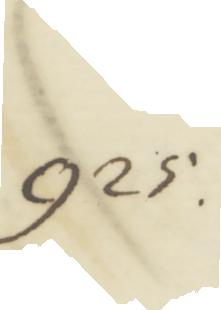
925.
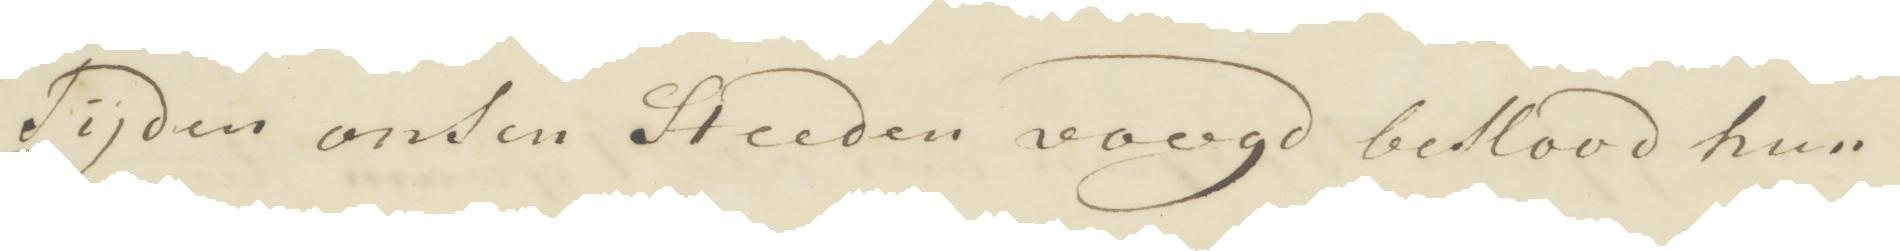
Tijden onsen steeden voogd beslood hun
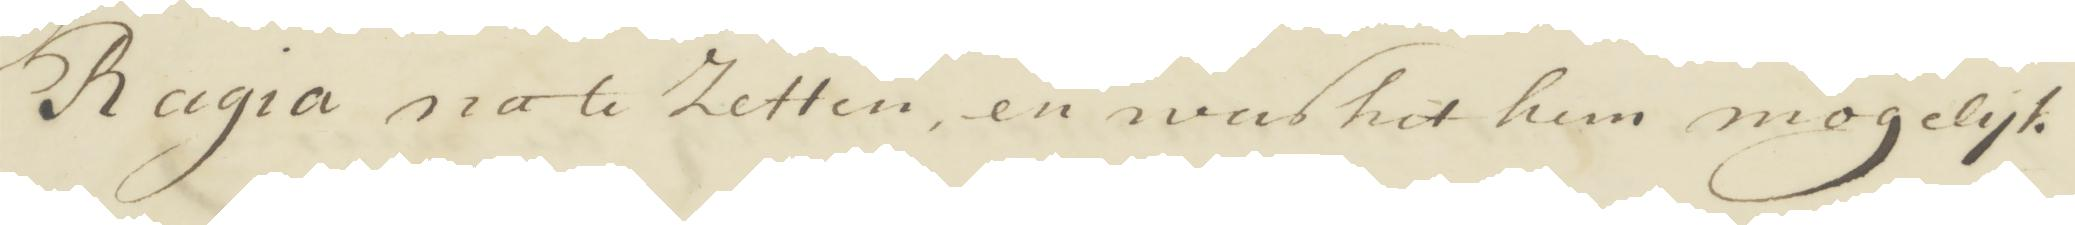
Ragia na te zetten en was het hem mogelijk
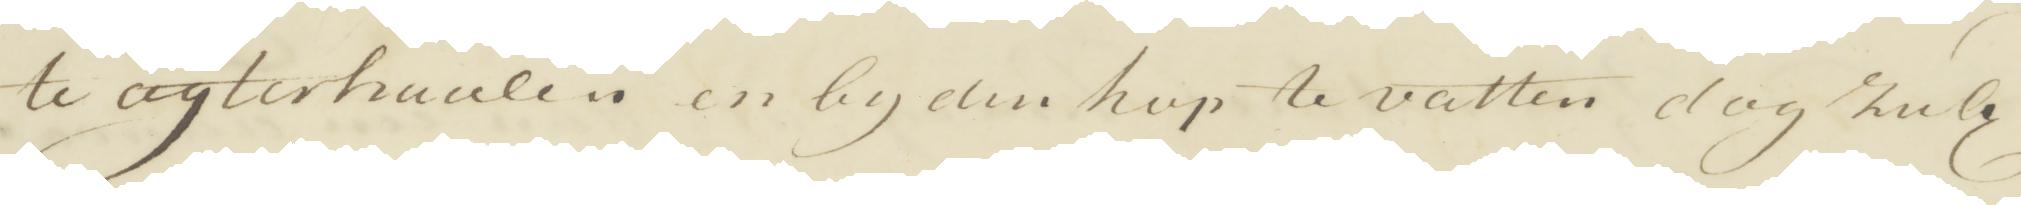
te agterhaalen en by den kop te vatten dog zulx
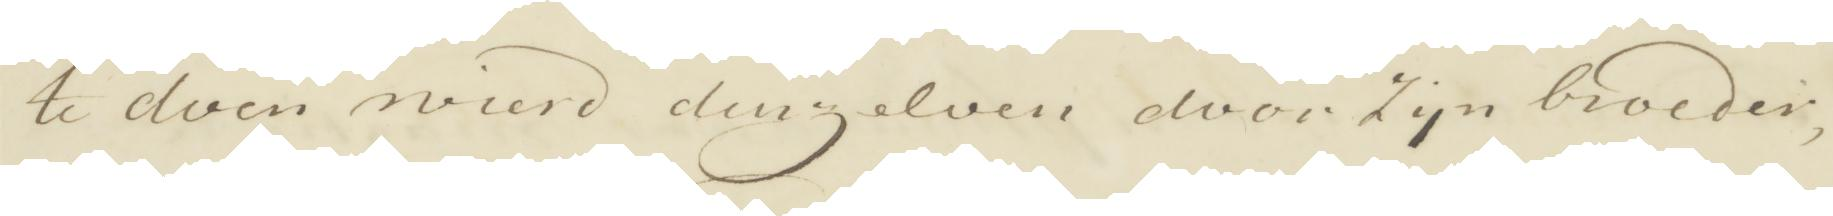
te doen wierd denzelven door zijn broeder
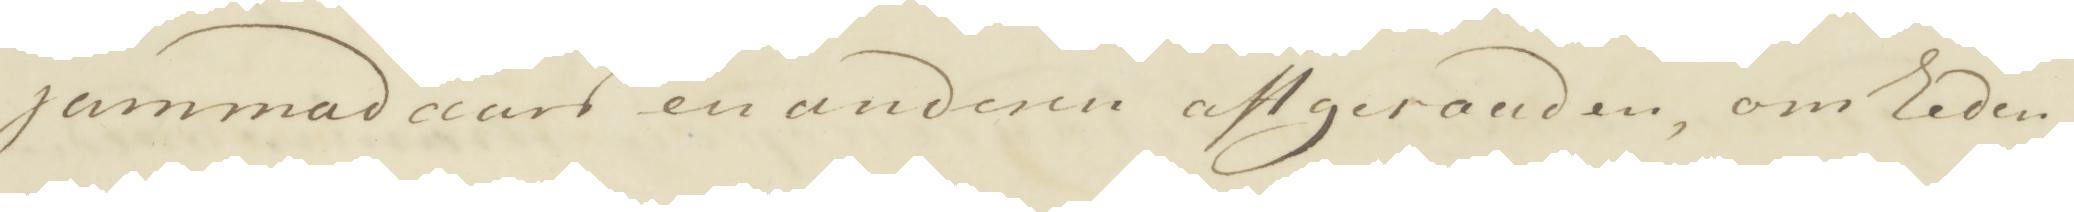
jammadaars en anderen affgeraaden, om heden
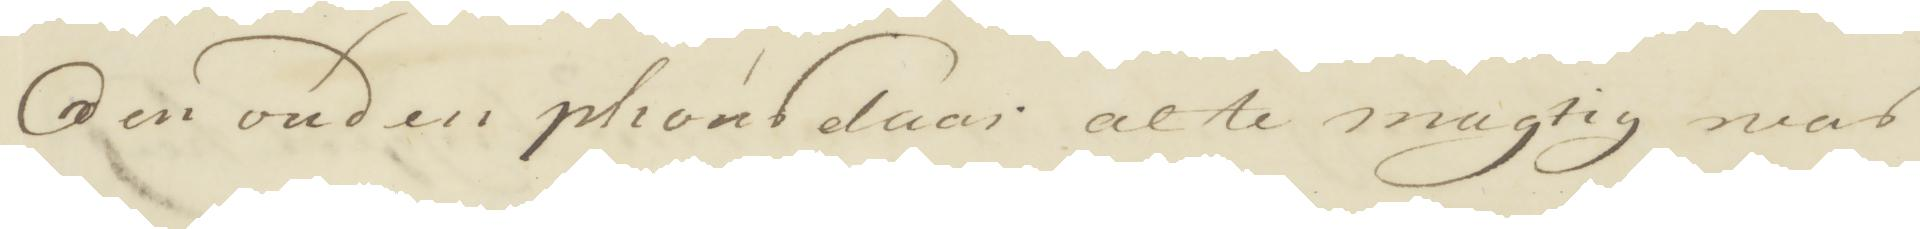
den ouden phous daar alte magtig was
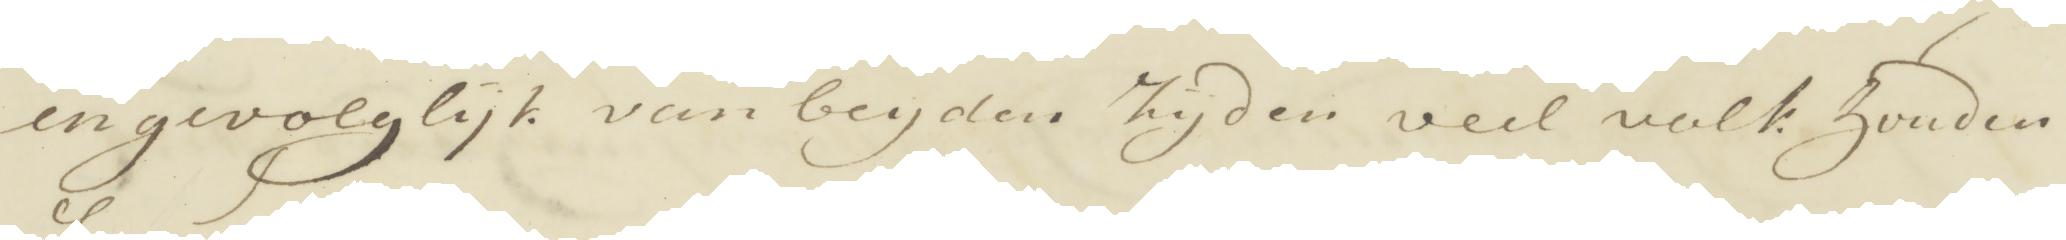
en gevolglijk van beijden zijden veel volk zouden
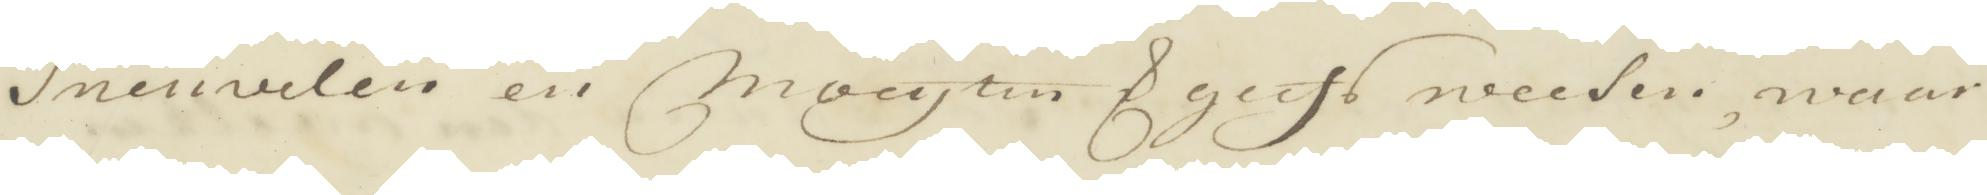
sneuvelen en moeyten vergeefs weesen, waar
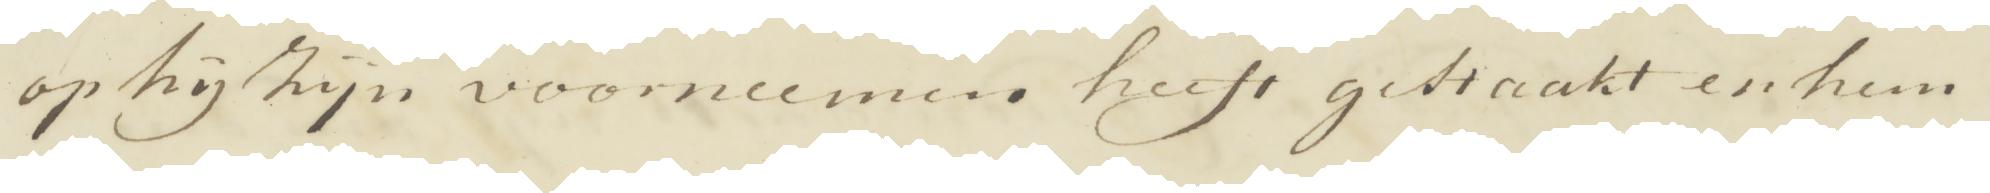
op hij zijn voorneemen heeft gestaakt en hem
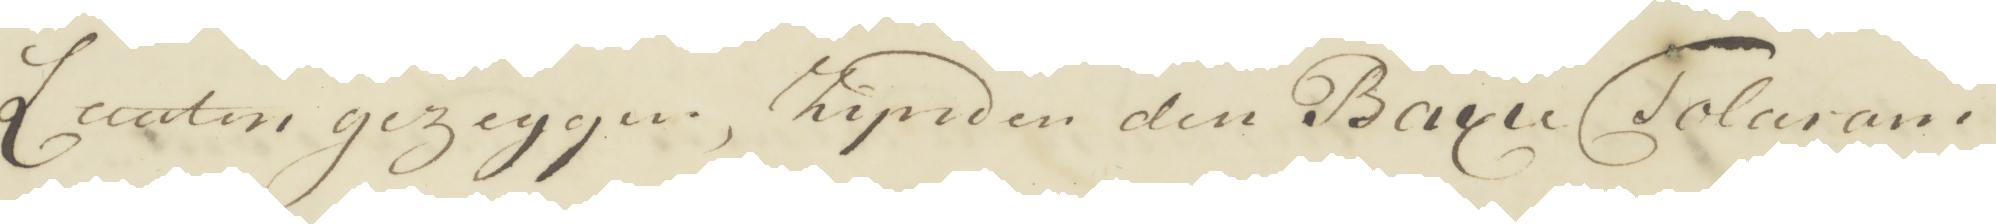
Laaten gezeggen, zijnden den Baxie Tolaram
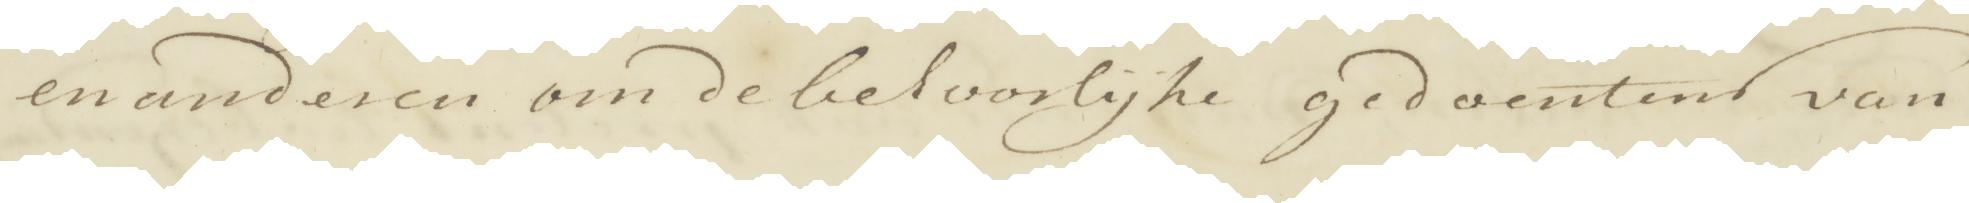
en anderen om de behoorlijke gedoentens van
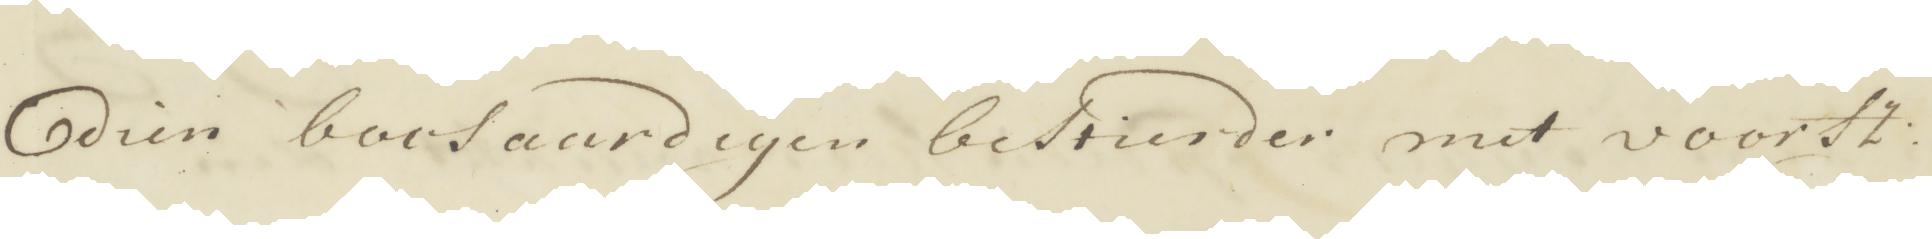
dien boosaardigen bestierder met voorsz:
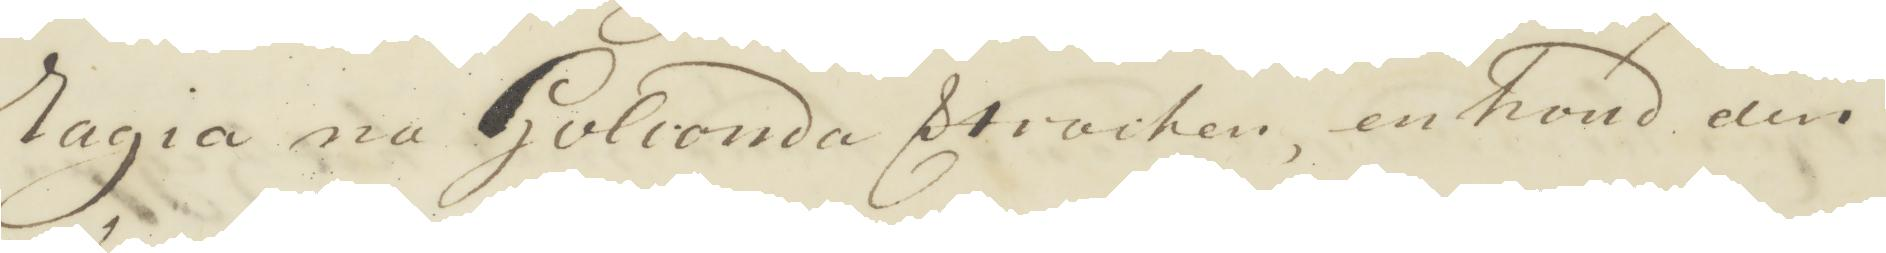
Ragia na Golconda vertrocken, en houd den
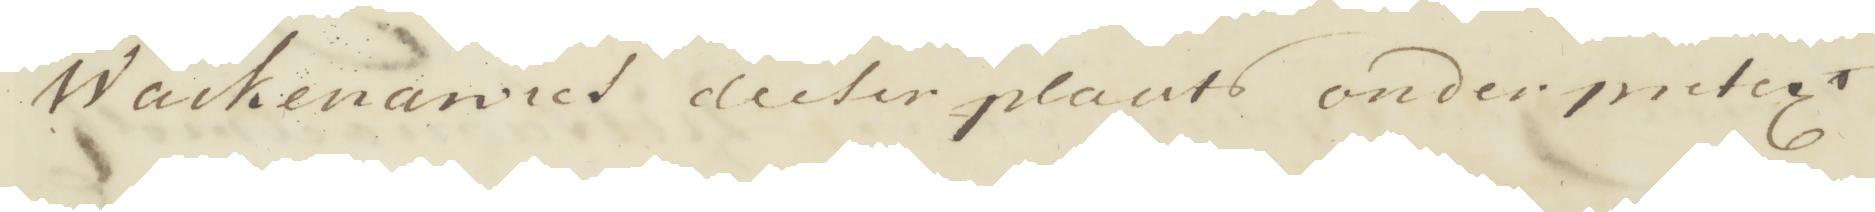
Waikenawies deeser plaats onder pretext
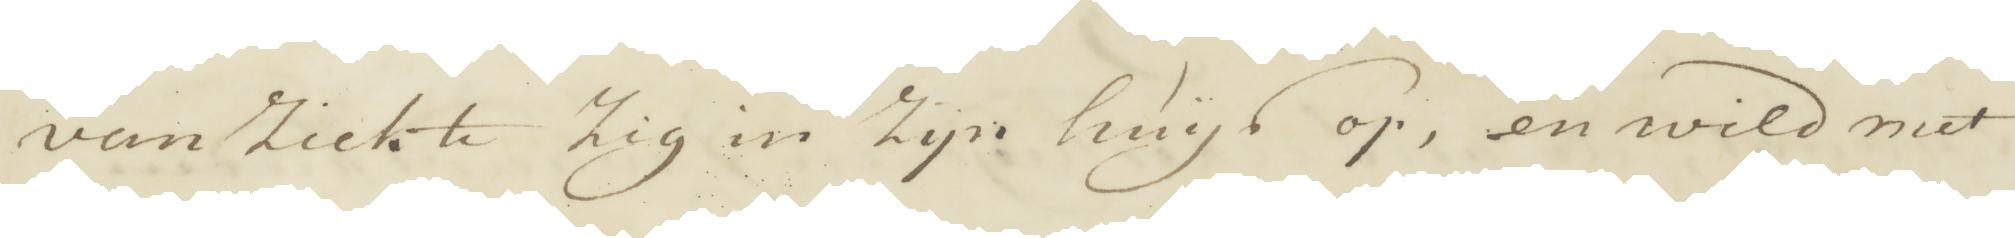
van ziekte zig in zijn huijs op, en wild met
